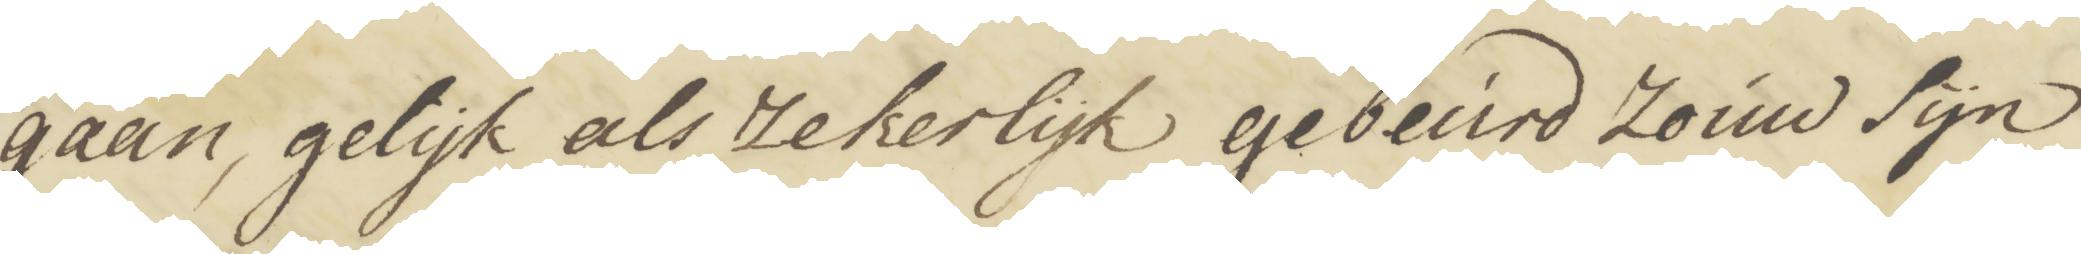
gaan, gelijk als zekerlijk gebeurd zouw sijn
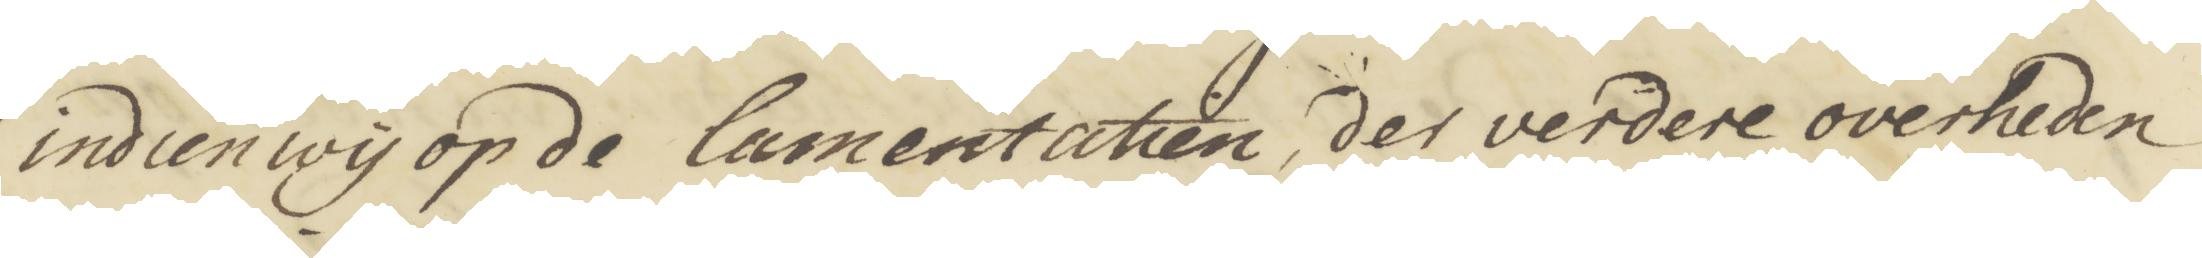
indien wij op de lamentatien, der verdere overheden
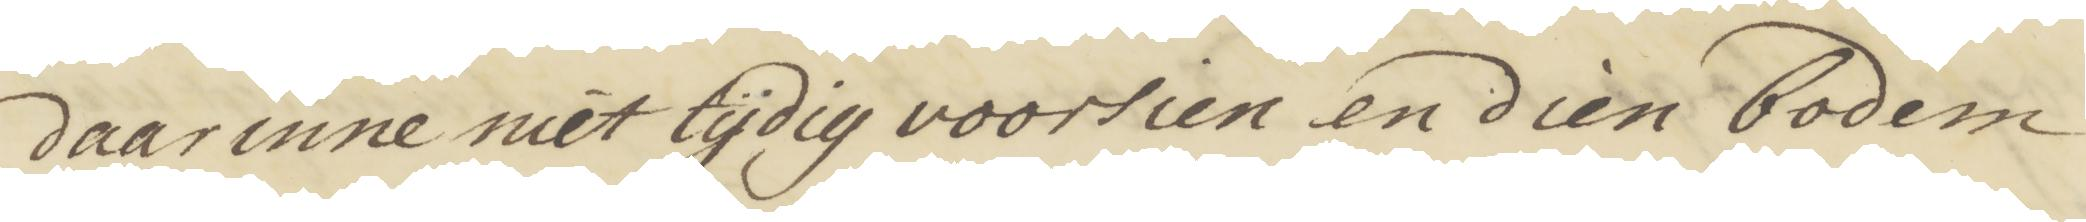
daar inne niet tijdig voorsien en dien bodem
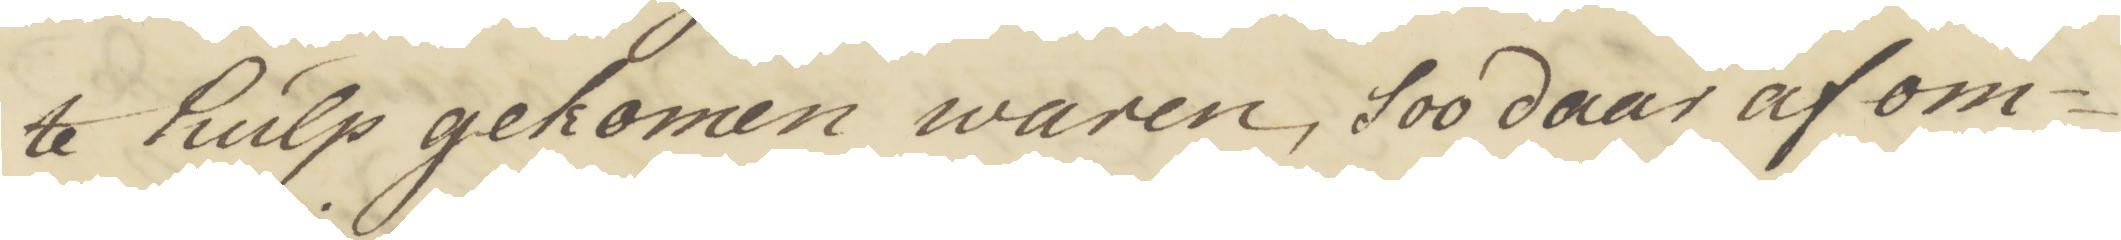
te hulp gekomen waren, soo daar af om=
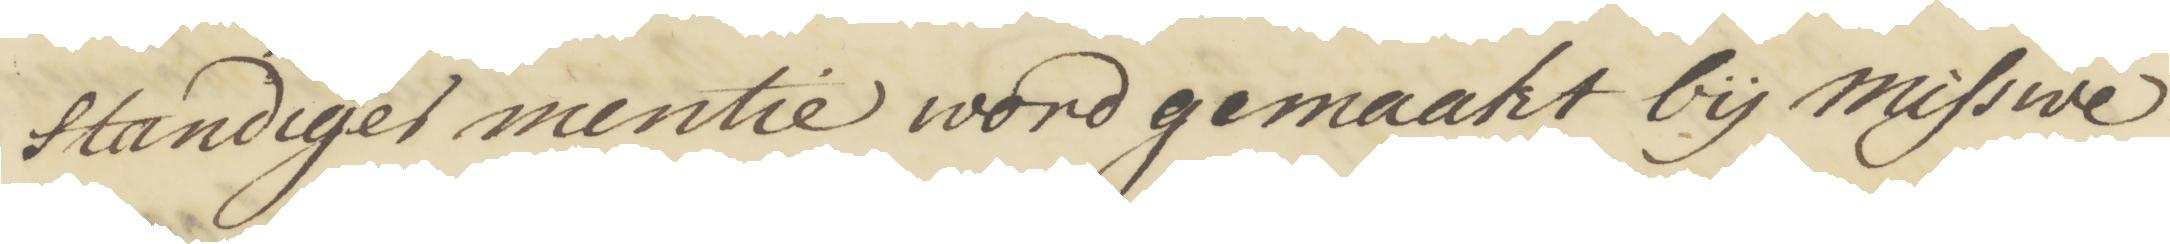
standiger mentie word gemaakt bij missive
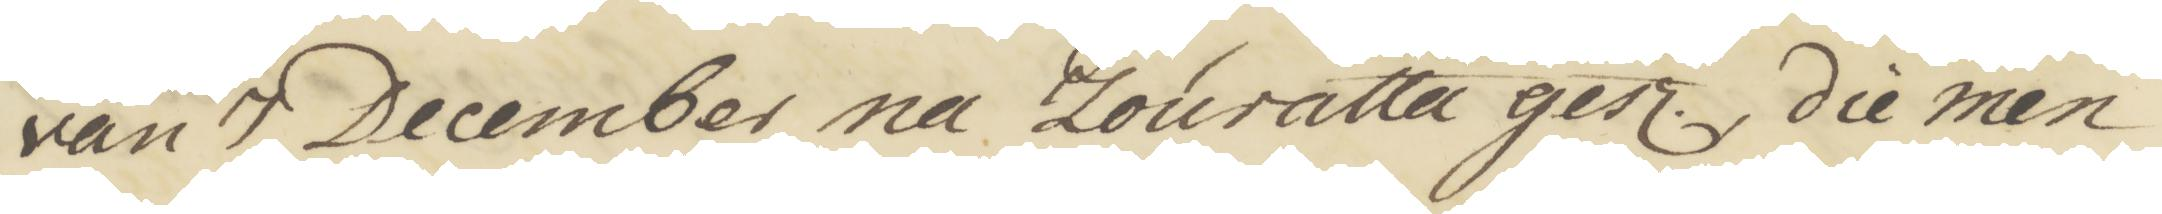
van 7 December na zouratta gesz., die men
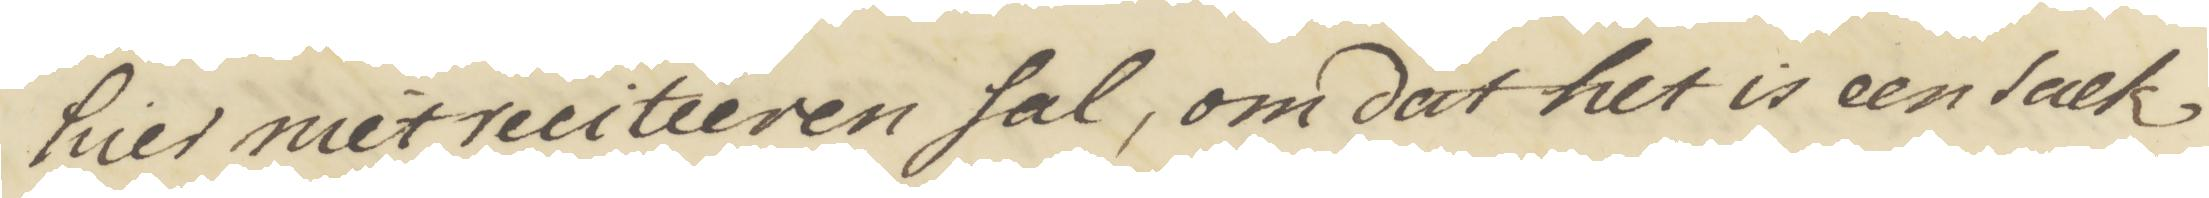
hier niet reciteeren sal, om dat het is een saek
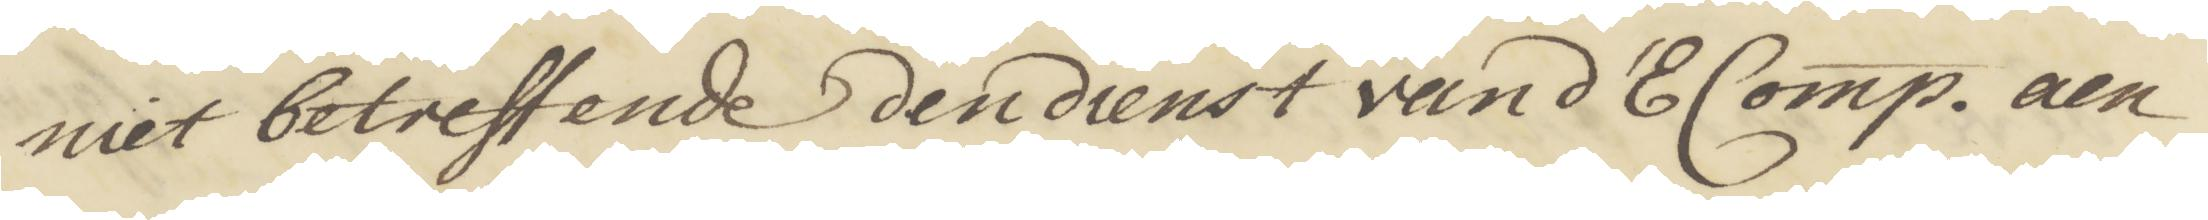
niet betreffende den dienst van d’E Comp. aen
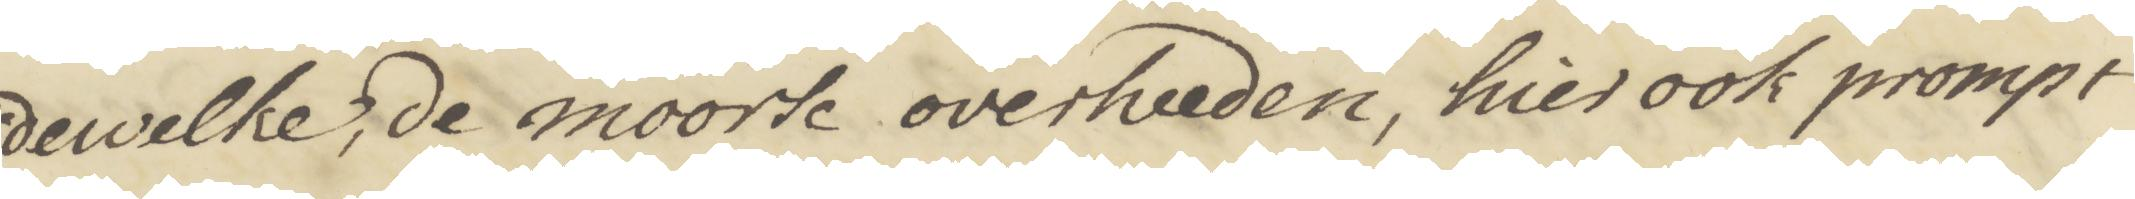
dewelke, de moorse overheeden, hier ook prompt
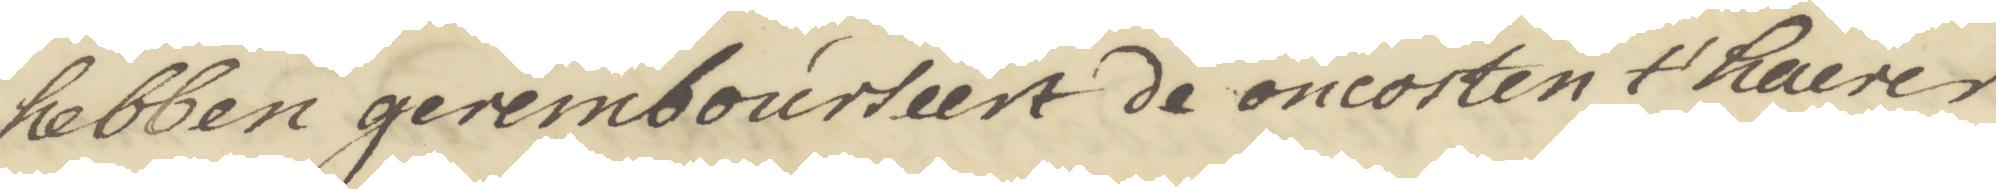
hebben gerembourseert de oncosten t' haerer
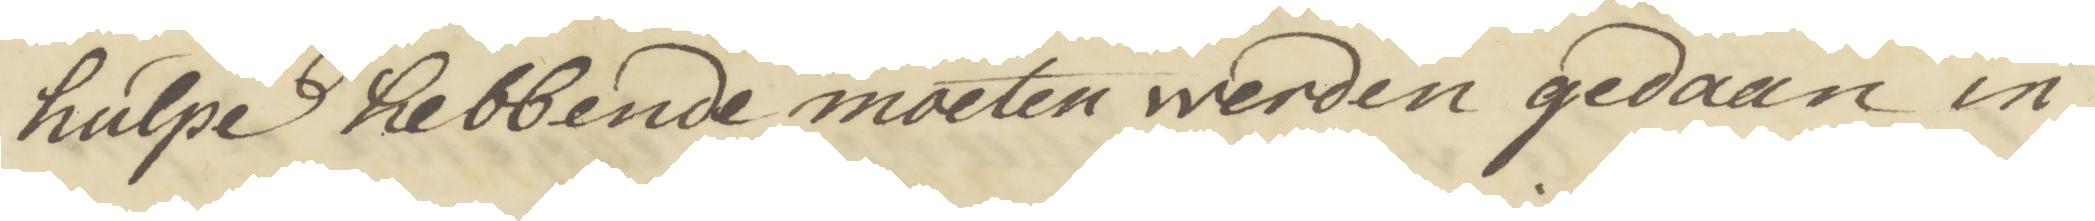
hulpe hebbende moeten werden gedaan in
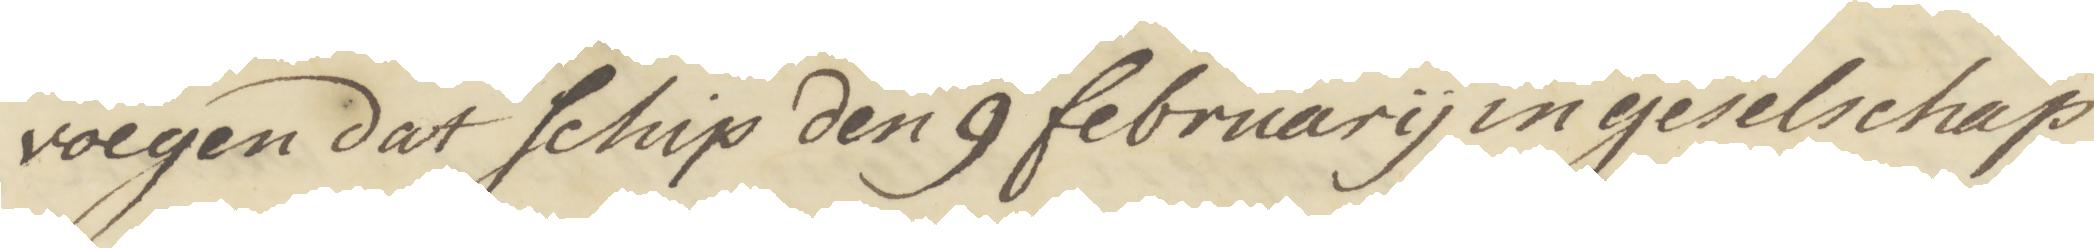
voegen dat schip den 9 februarij in geselschap
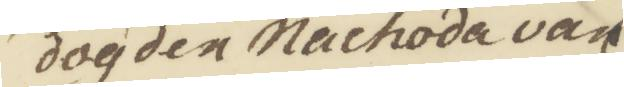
dog den nachoda van
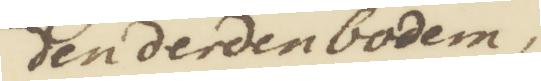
den derden bodem,
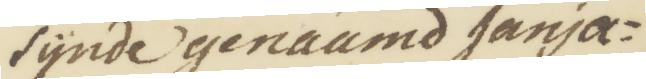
sijnde genaamd Janja=
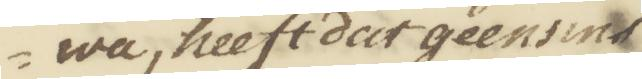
=wa, heeft dat geensins
